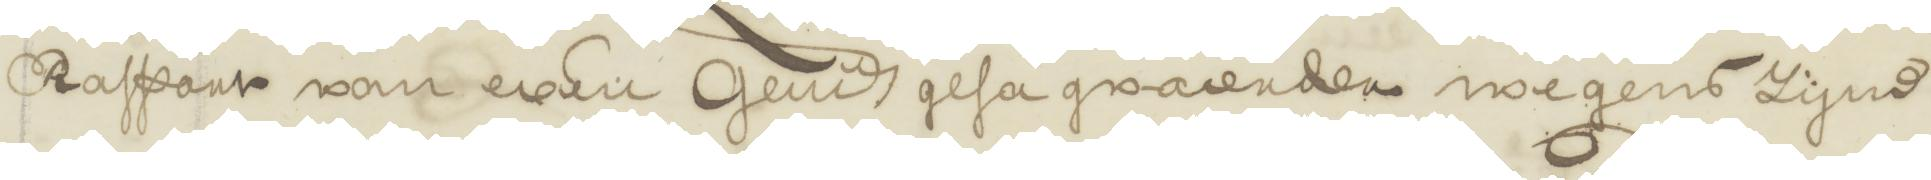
Rapport van even geme gesagvoerder wegens zijne
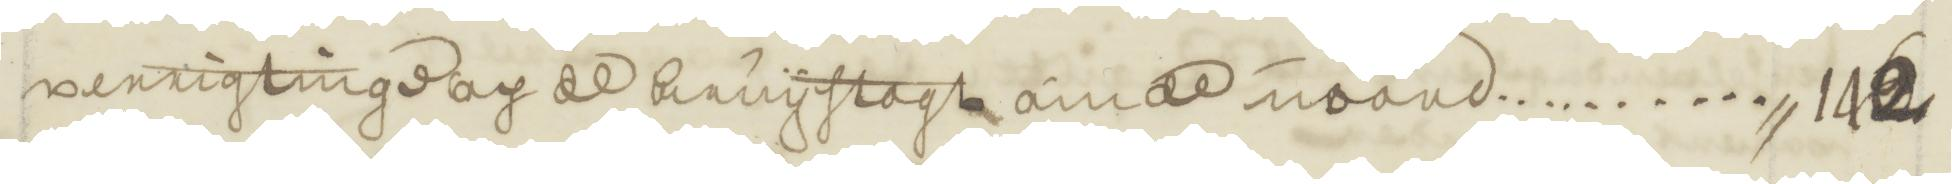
verrigtinge op de kruijstogt om de noord.......... „142
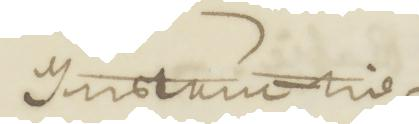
Instructie
